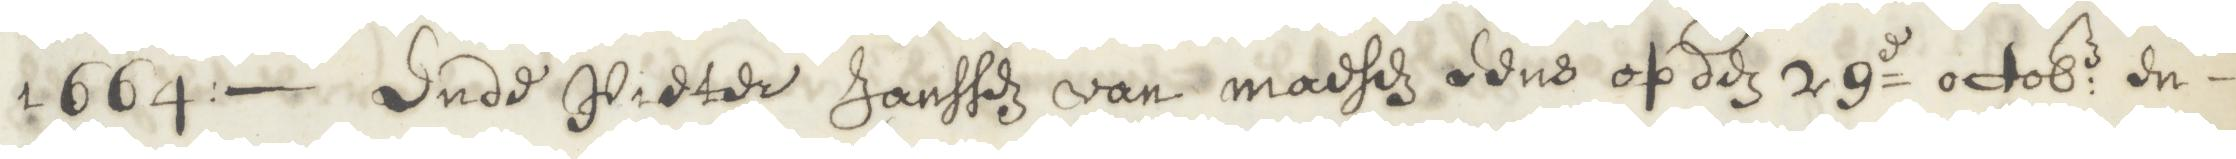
1664:— Ende Pieter Janssen van maesen eens op den 29=e octob:r en —
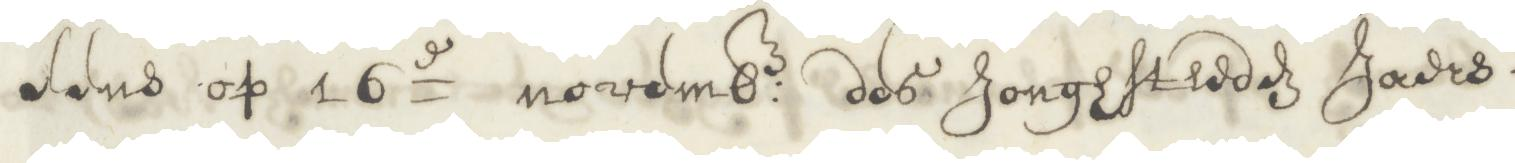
eens op 16=e novemb:r des Jonghstleden Jaers.
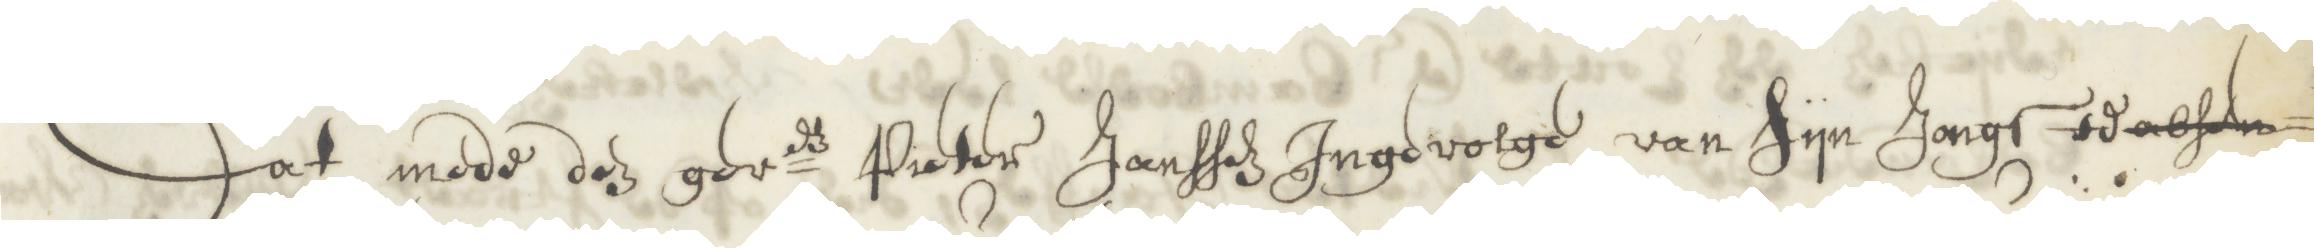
Dat mede den gev=en Pieter Janssen Ingevolge van sijn Jongste absen=
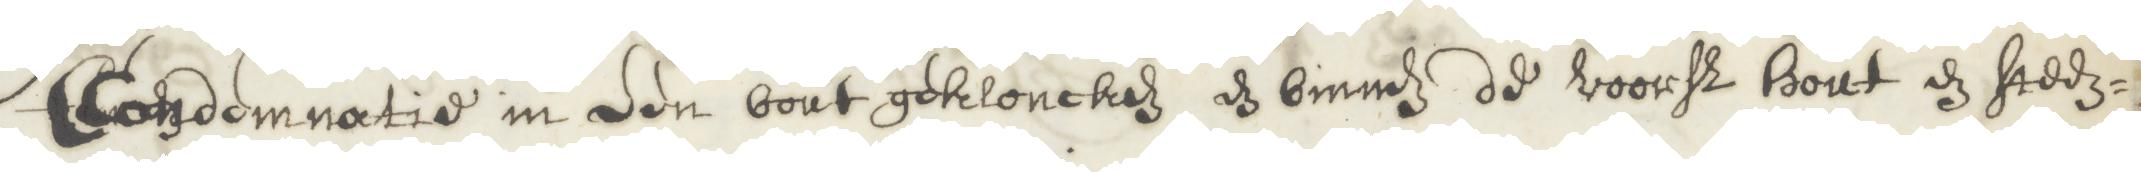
Condemnatie in een bout gekloncken en binnen de voorsz hout en steen=
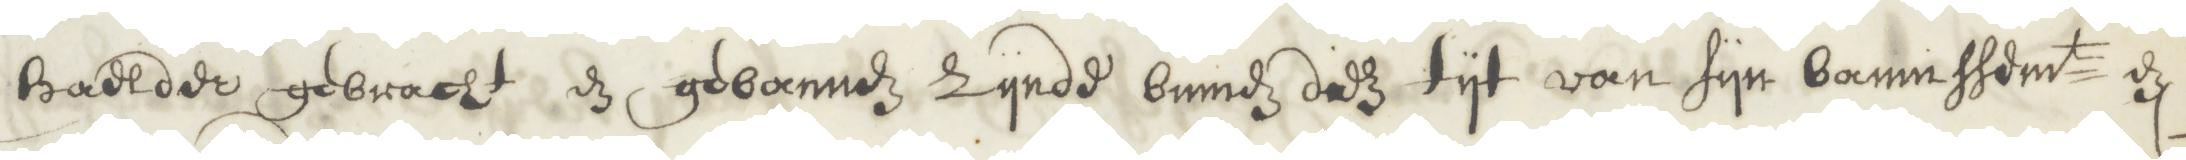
haelder gebracht en gebannen zijnde binnen den tijt van sijn bannissem=t en
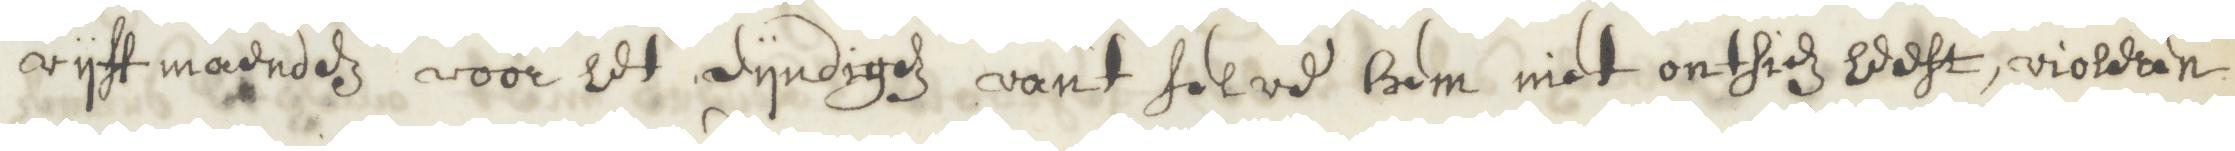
vijff maenden voor het eijndigen van't selve hem niet ontsien heeft, violeren
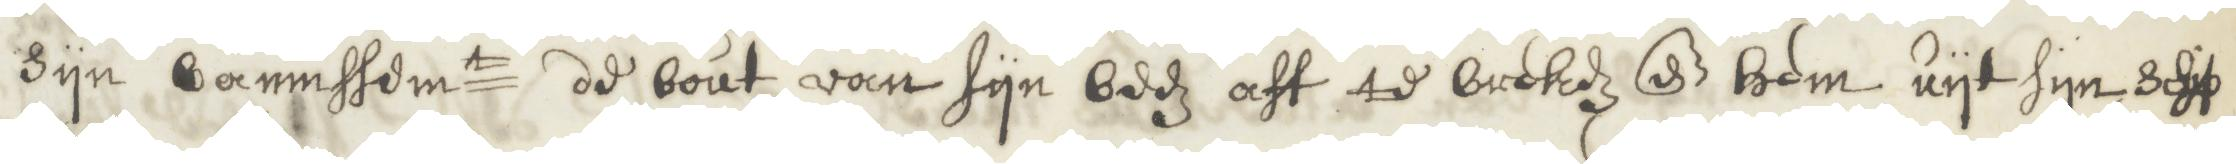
sijn bannissem=t de bout van sijn been aff te breken ende hem uijt sijn schip
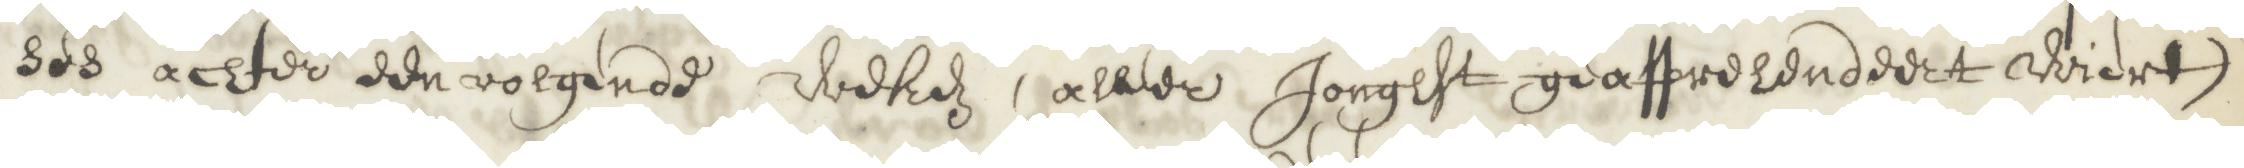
ses achter een volgende weken (aleer Jonghst geapprehendeert wiert)
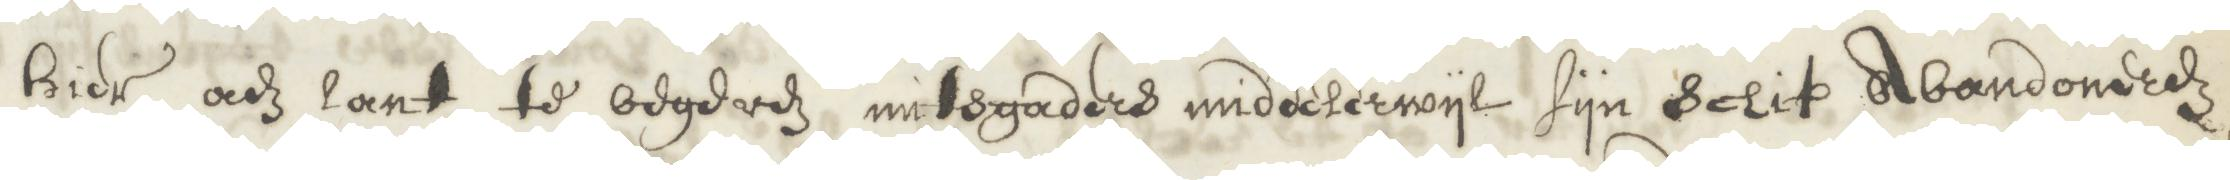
hier aen lant te begeven mitsgaders middelerwijl sijn schip Abandoneren
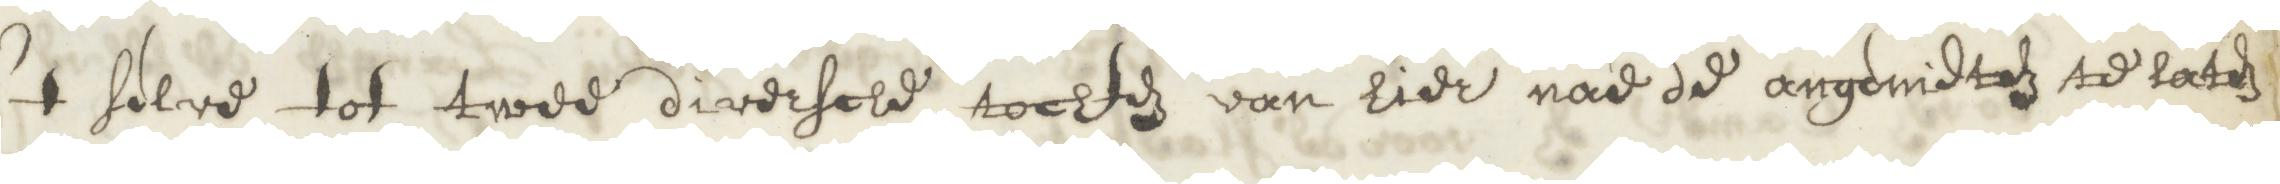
’t selve tot twee diversche tochten van hier nae de angenieten te laten
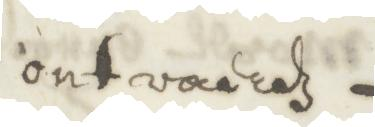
ontvaaren -
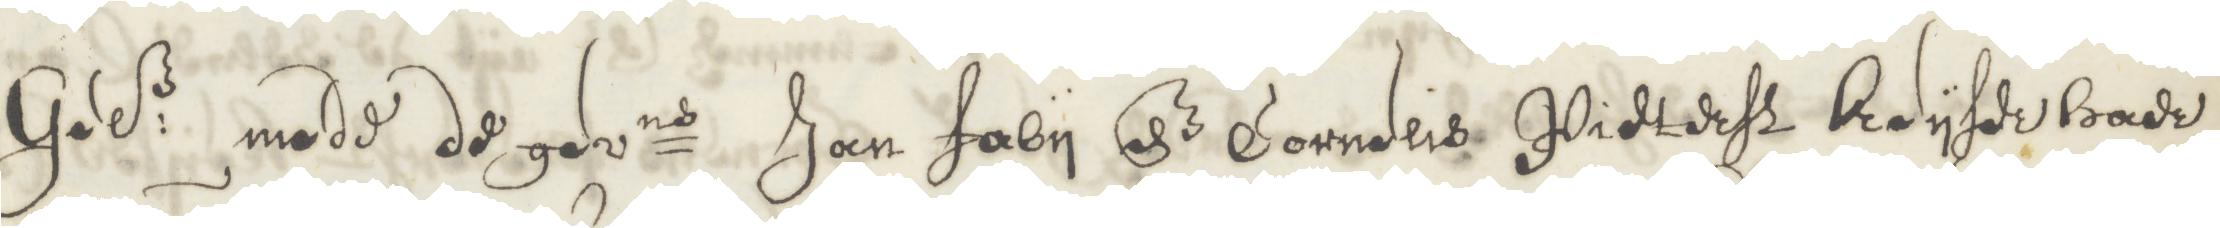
Ged:e mede de gev=ns Jan fabij ende Cornelis Pietersz keijser haer
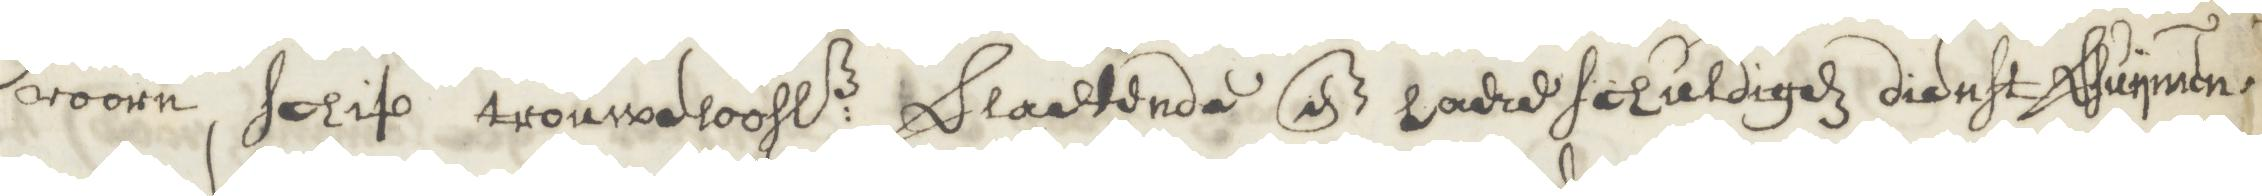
voorn schip trouwelooslijk verlaetende ende haere schuldigen dienst versuijmen,
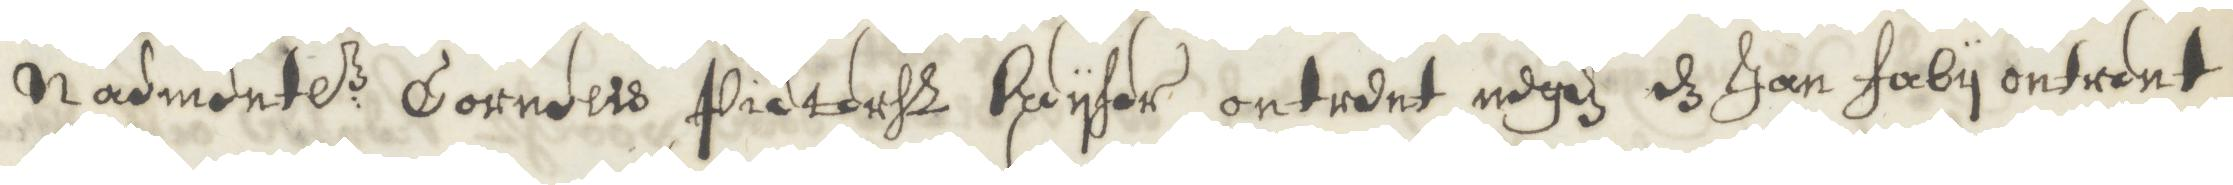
naementlijk Cornelis Pietersz keijser ontrent negen en Jan fabij ontrent
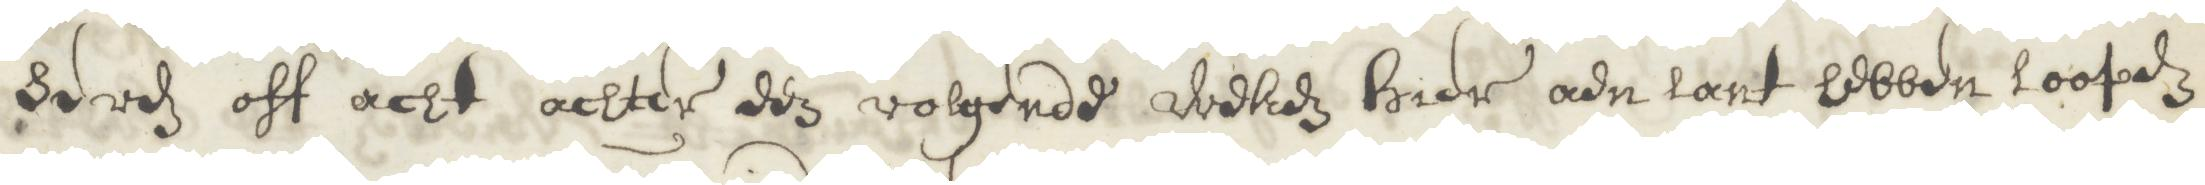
seven off acht achter een volgende weken hier aen lant hebben loopen
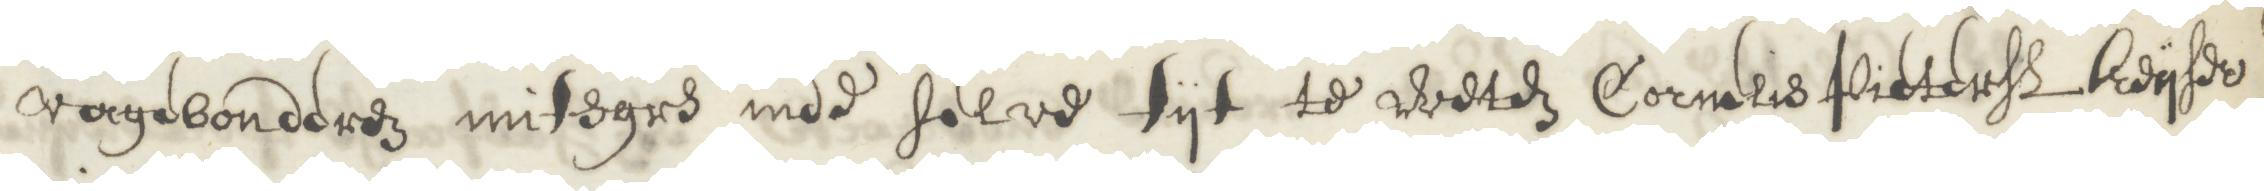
vagebonderen mitsgrs inde selve tijt te weten Cornelis Pietersz keijser
